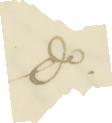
d.o
